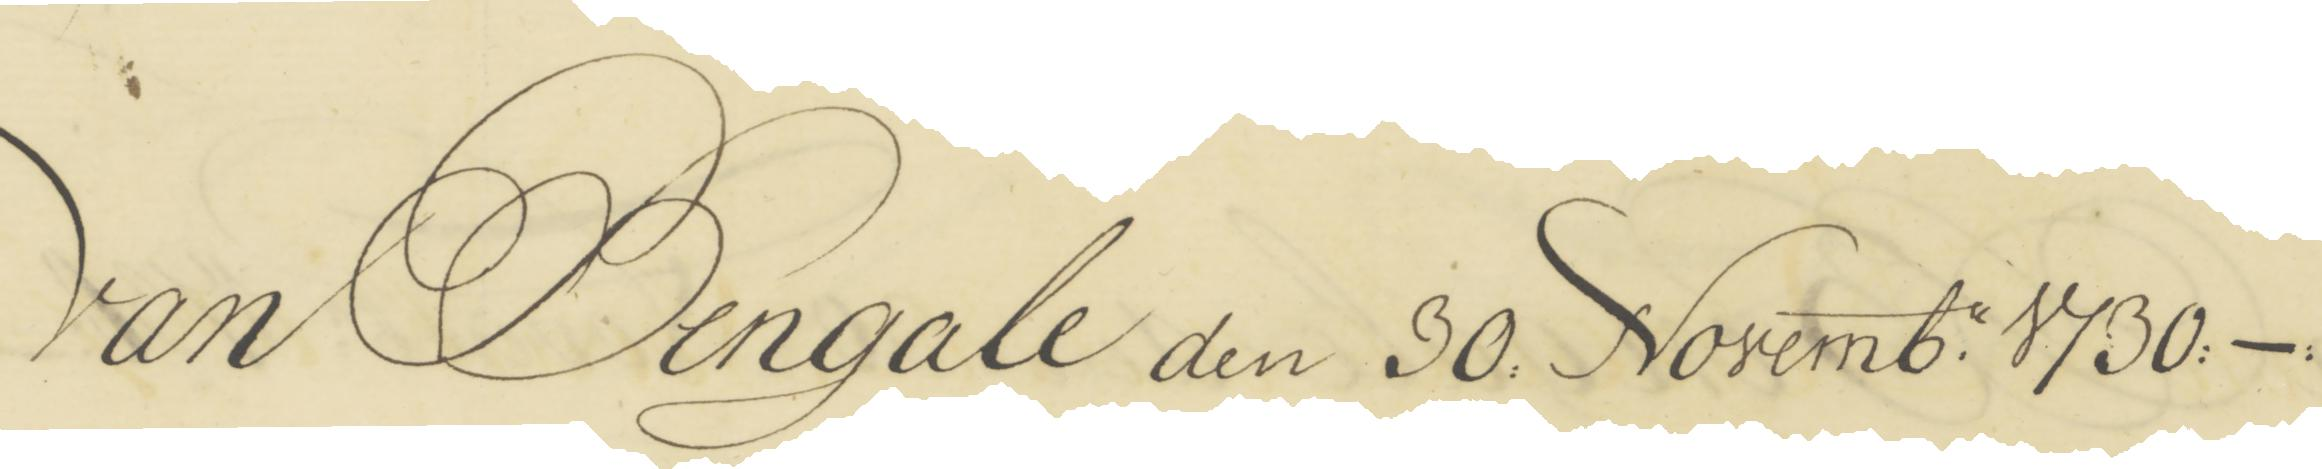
Van Bengale den 30. Novemb.r 1730:-:
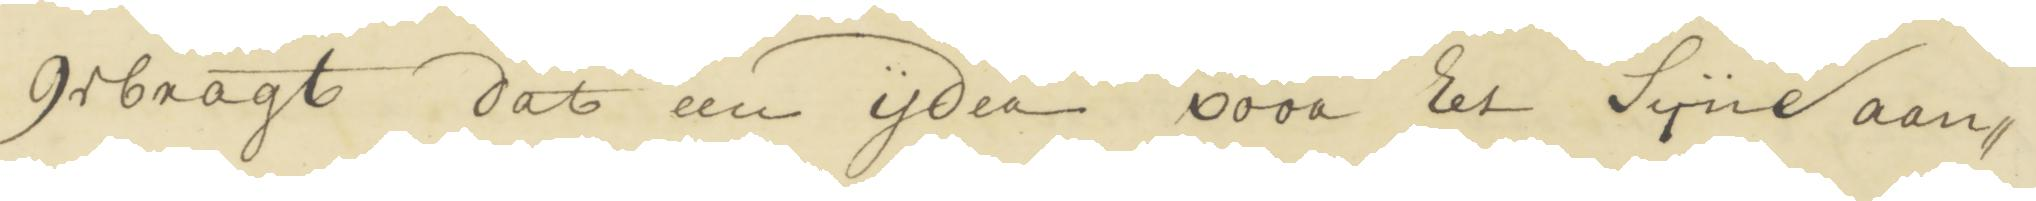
gebragt dat een ijder voor het sijne aan„
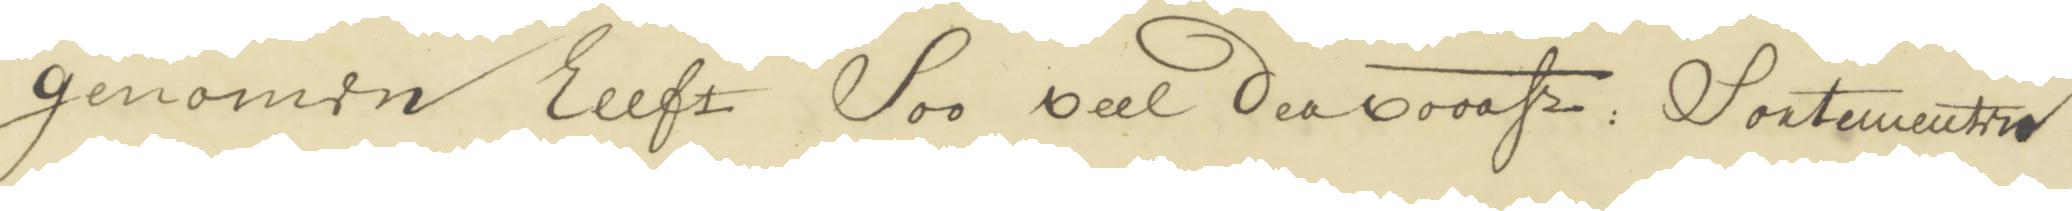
genomen heeft soo veel der voorsz: sortementen
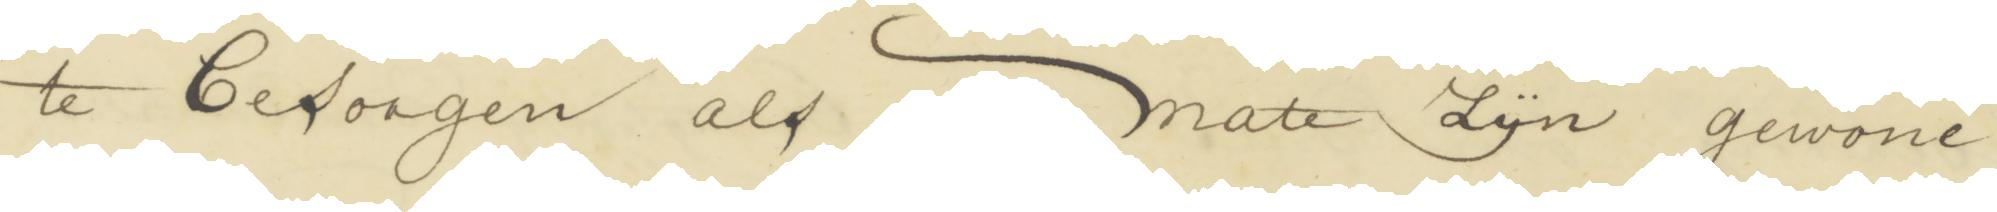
te besorgen als na mate zijn gewone
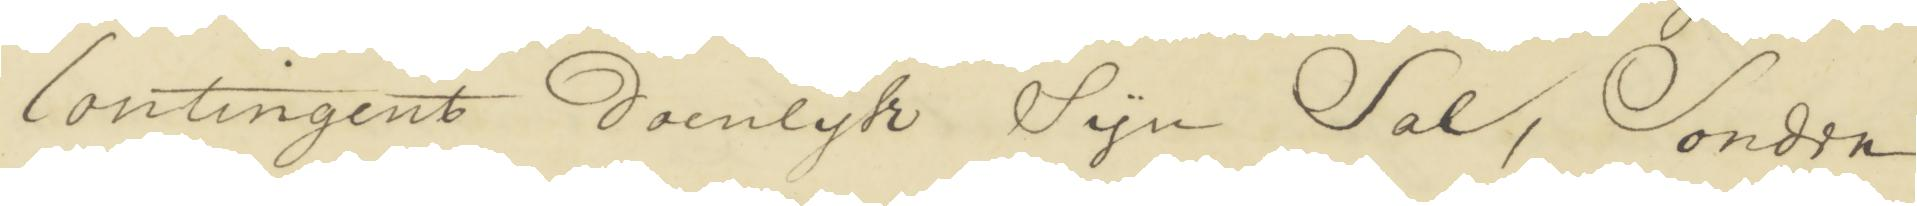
Contingent doenlijk sijn sal, sonder
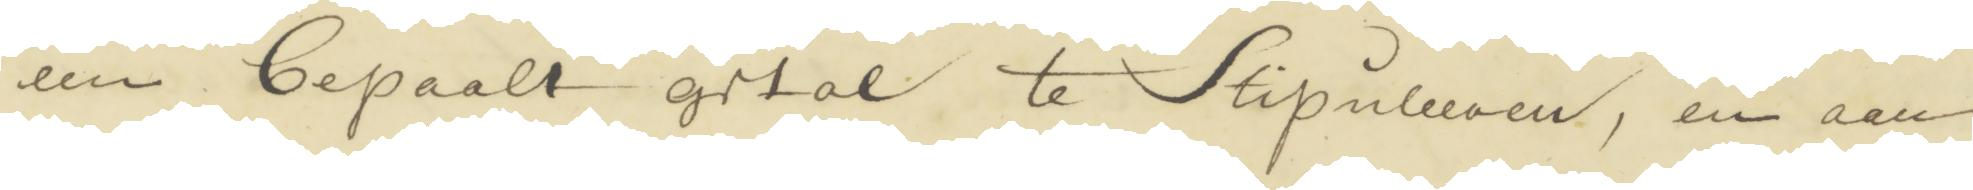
een bepaalt getal te stipuleeren, en aan
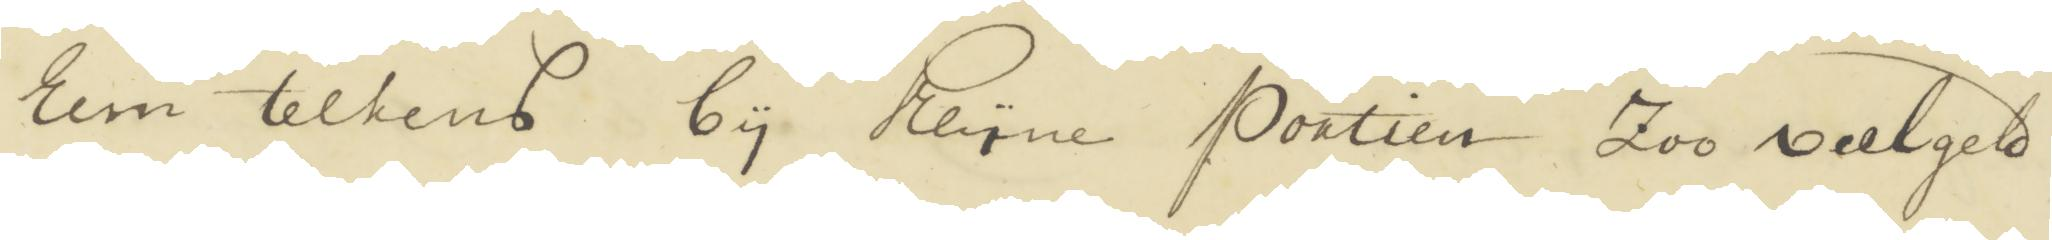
hem telkens bij klijne Portien zoo veel geld
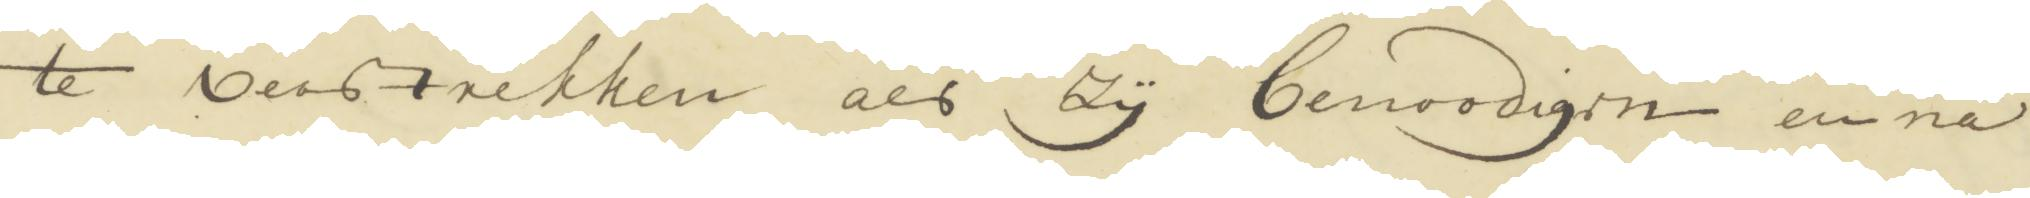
te verstrekken als zij benoodigen en na
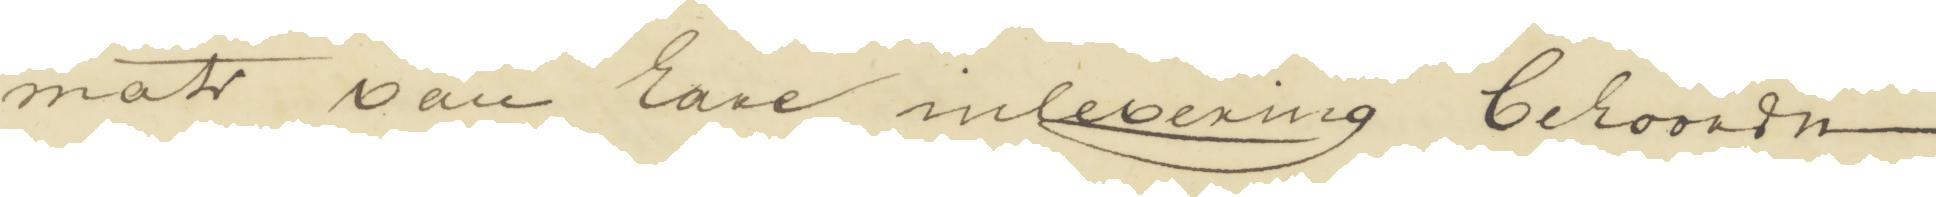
mate van hare inlevering behooren
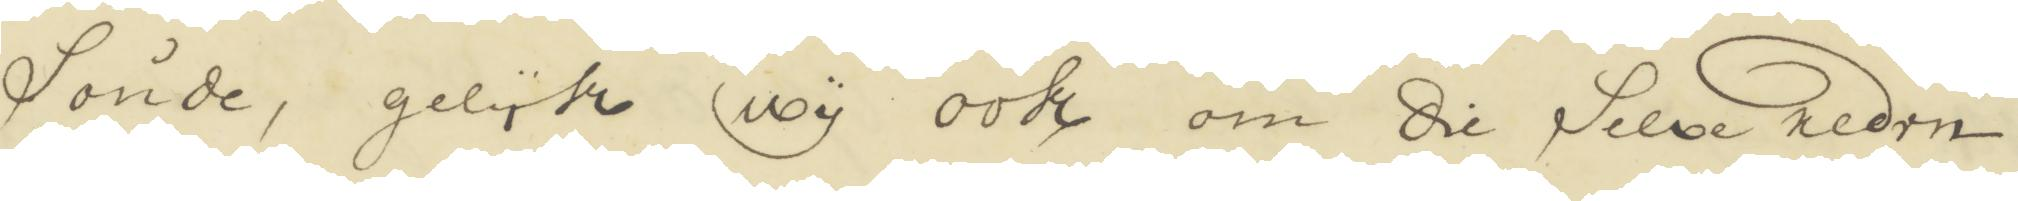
soude, gelijk wij ook om die selve reden
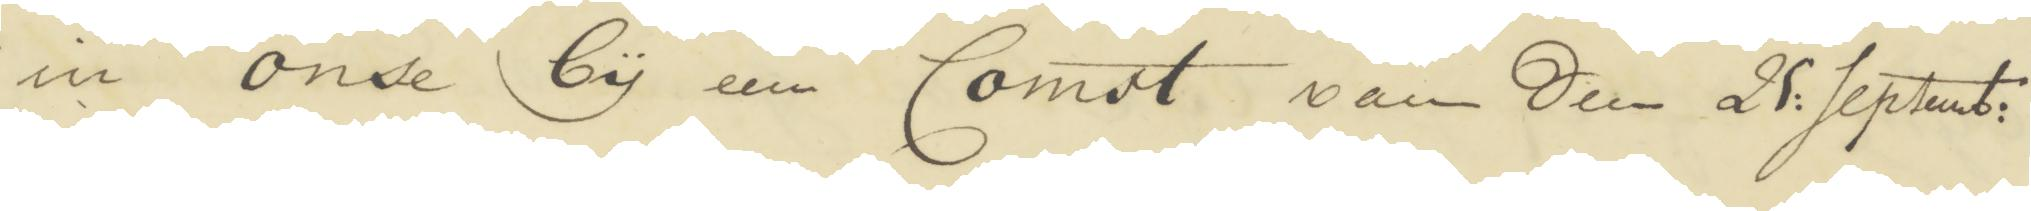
in onse bij een Comst van den 25: septemb:
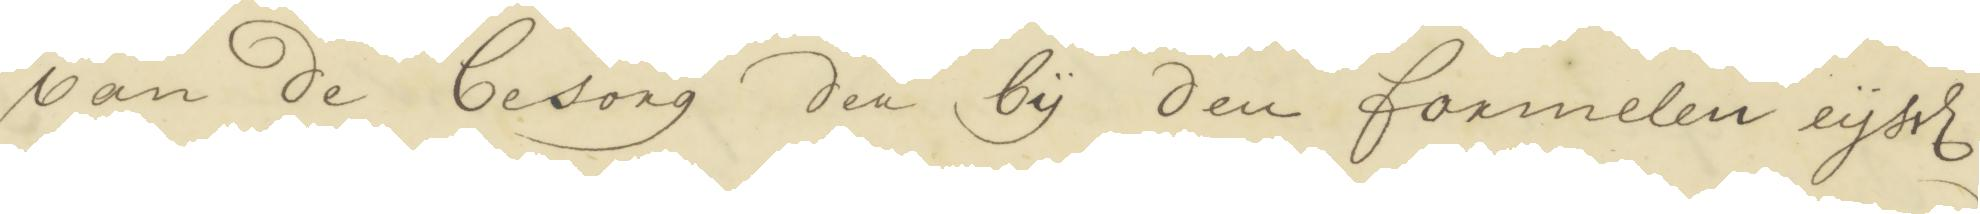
van de besorg der bij den formelen eijsch
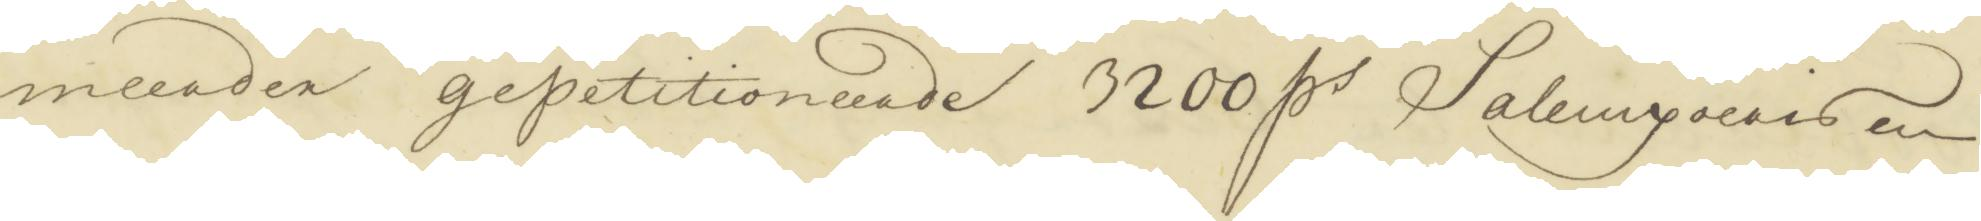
meerder gepetitioneerde 3200 p's Salempoeris en
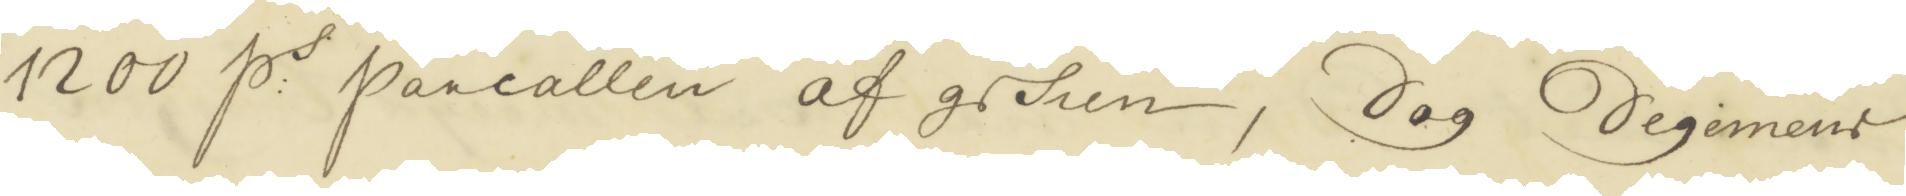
1200 p:s parcallen af gesien, dog de gemene
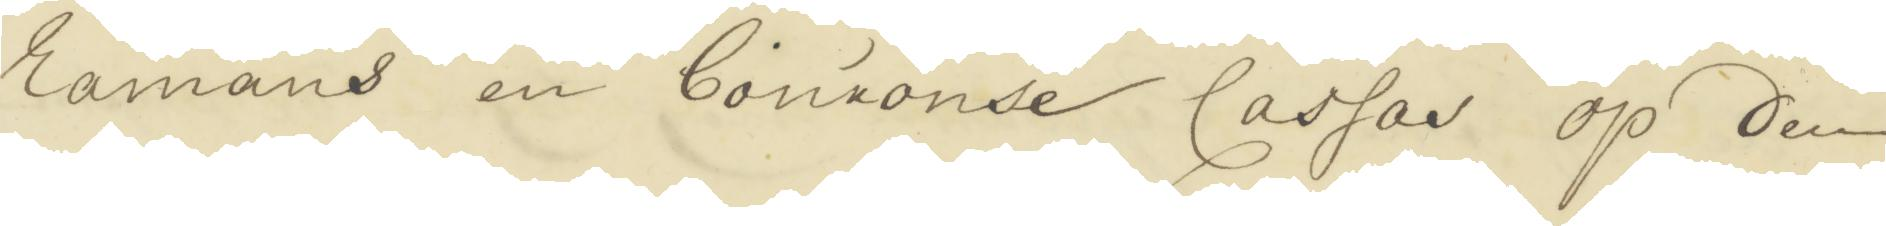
hamans en bouronse Cassas op den
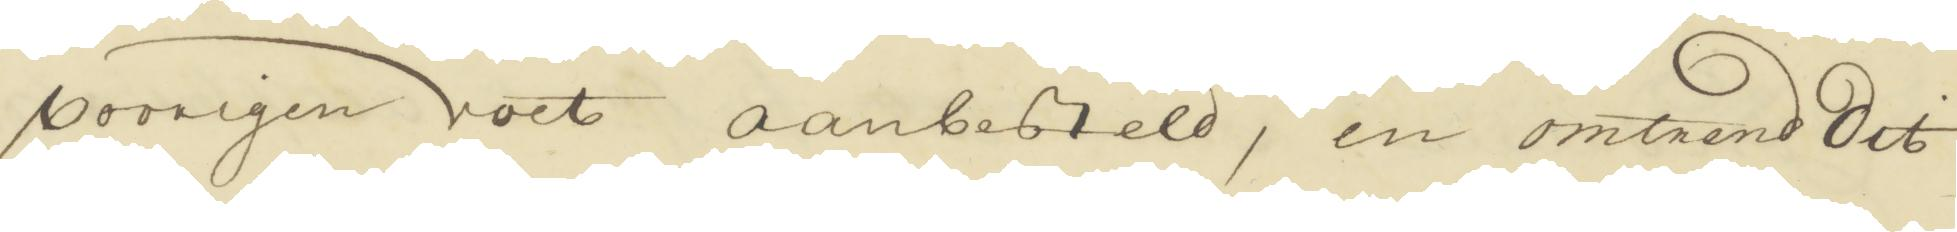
voorigen voet aanbesteld, en omtrend dit
